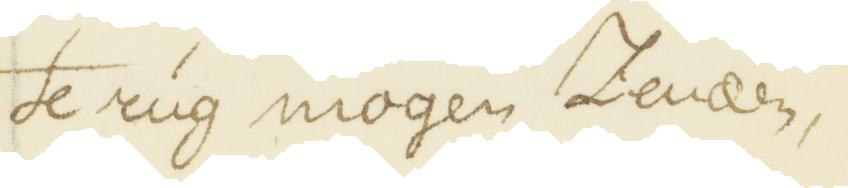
te rug mogen zenden,
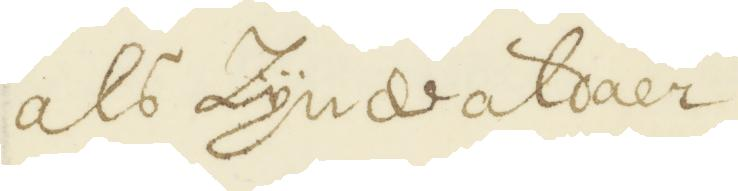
als zijnde aldaer
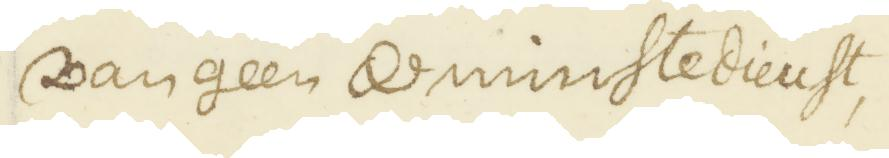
van geen de minste dienst,
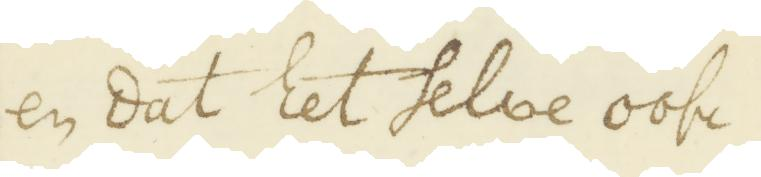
en dat het selve ook
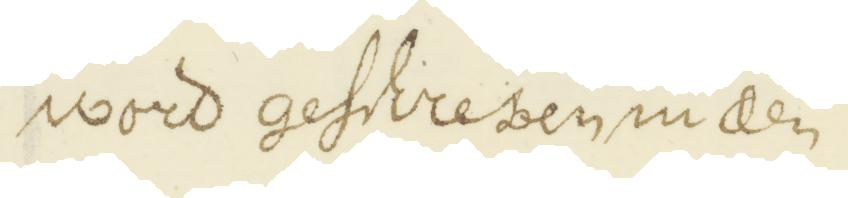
word geschreven in den
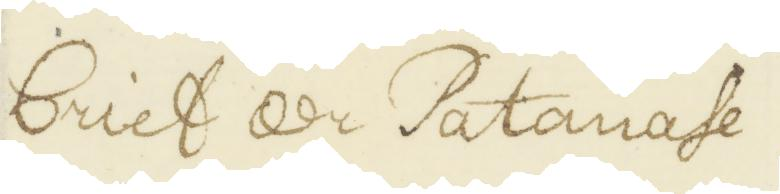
brief der Patanase
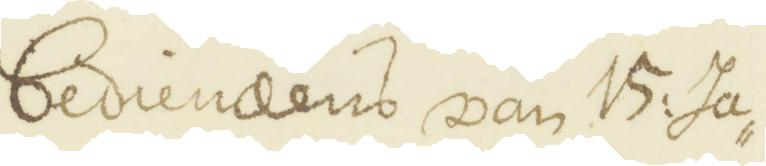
bediendens van 15: Ja„
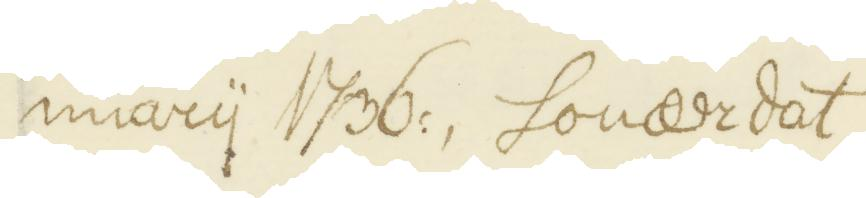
nuarij 1736:, sonder dat
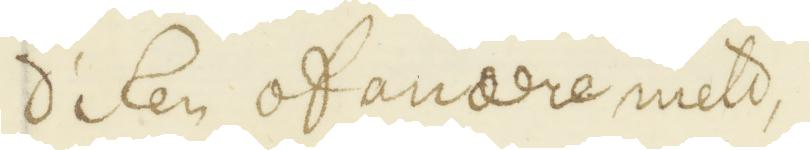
d’Een of andere meld,
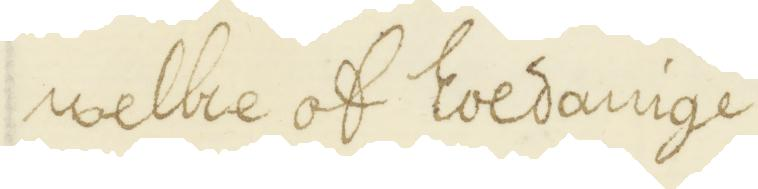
welke of hoedanige
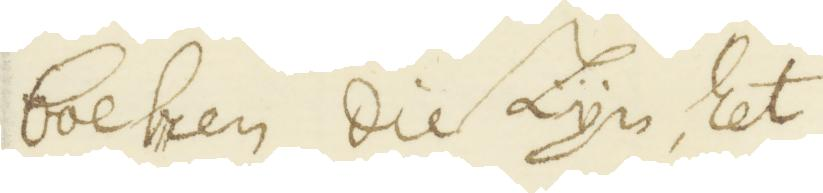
boeken die zijn, het
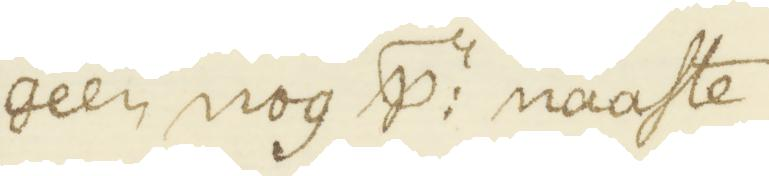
geen nog p:r naaste
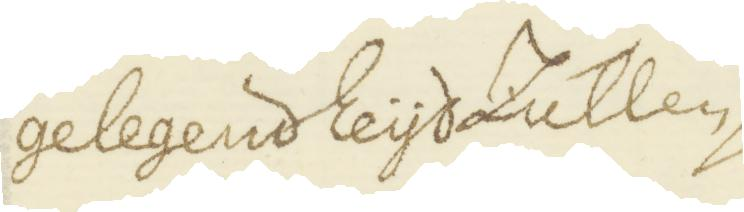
gelegendheijd zullen
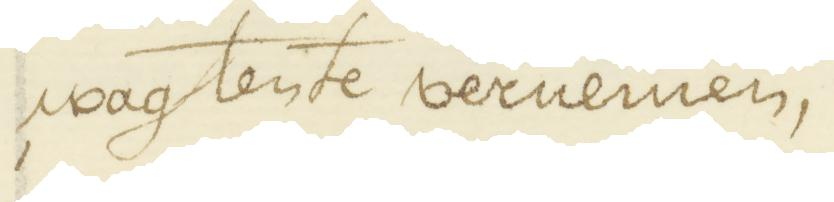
,wagten te vernemen,
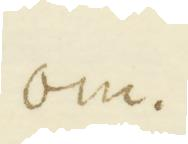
om.
